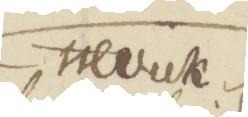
hluuk
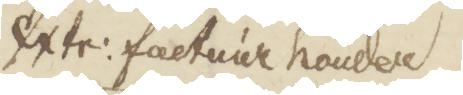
extr: factuur houder
